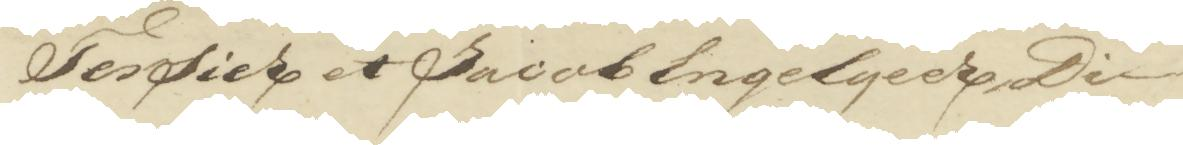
Tessier et Jacob Engelgeer, Dir
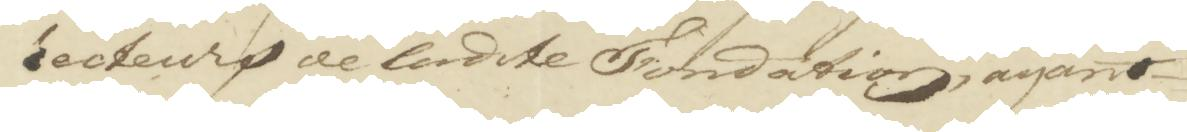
recteurs de ladite Fondation, ayant
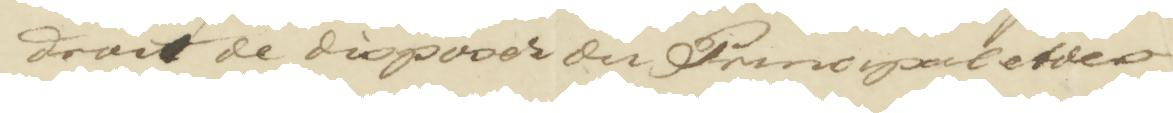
droit de disposer du Principal etdes
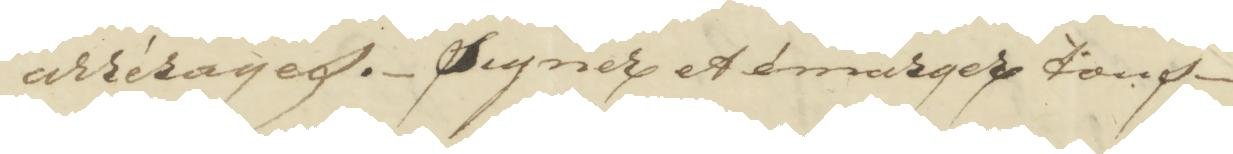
arrerayes. Signez et emarger tous
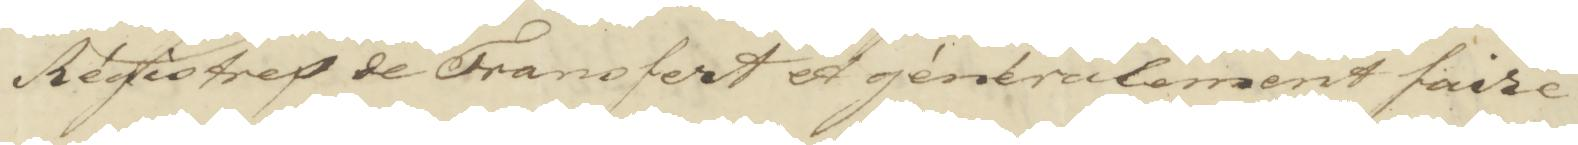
Registres de Transfert et generalement faire
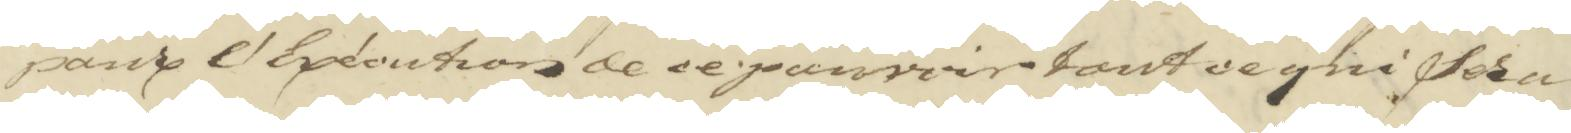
pour l'Execution de ce pouvoir tout ce qui sera
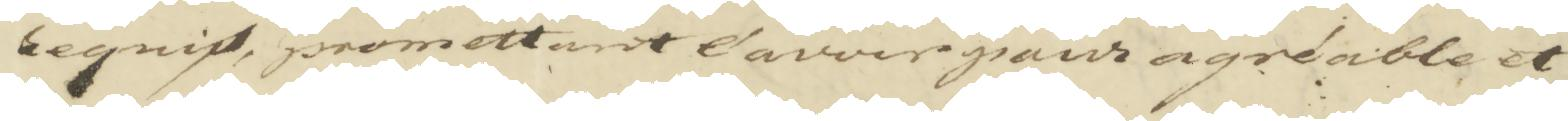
requis, promettant l'avoir pour agreable et
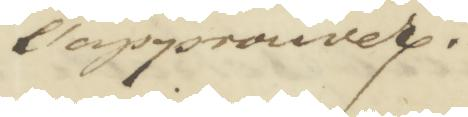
l'approuver.
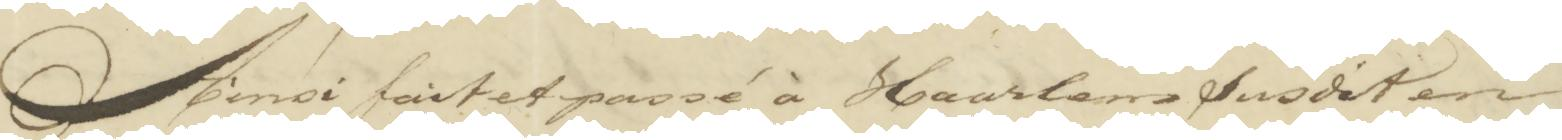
Ainsi fait et passe a Haarlem susdit en
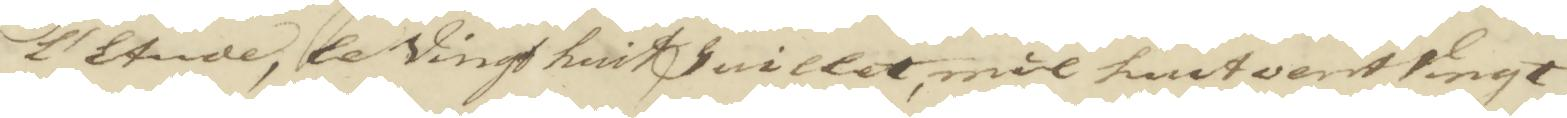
L'Etude, le Vingt huit Juillet, mil huit cent Vingt
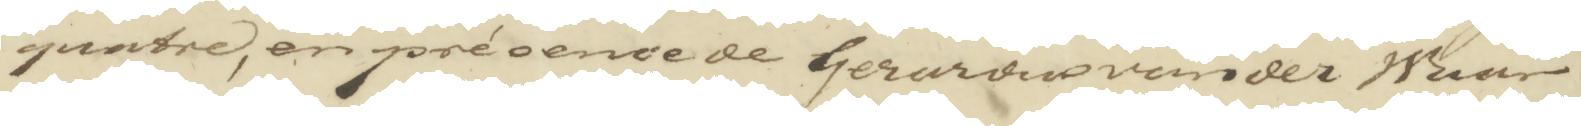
quatre, en presence de Gerardus van der Waar
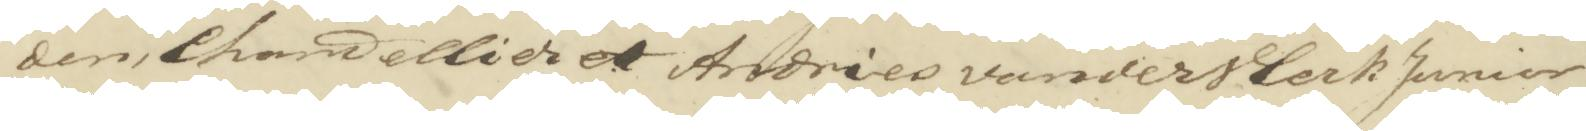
den, Chandellier et Andries vanderVlerk Junior
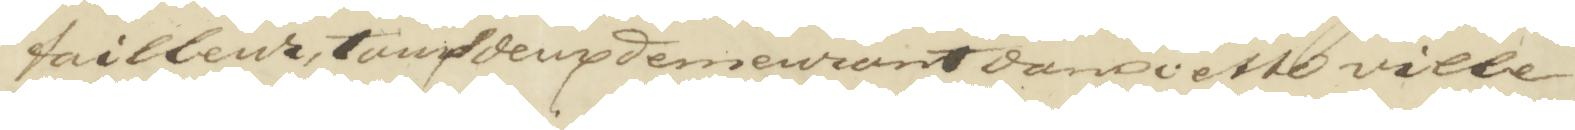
tailleur, tous deux demeurant dans cette ville
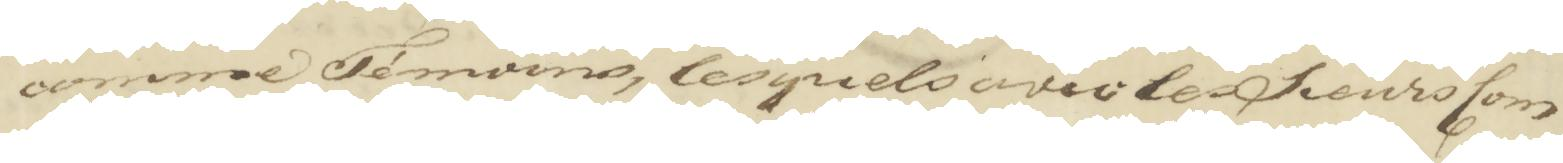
comme Temoins, lesquels avec les Sieurs Com
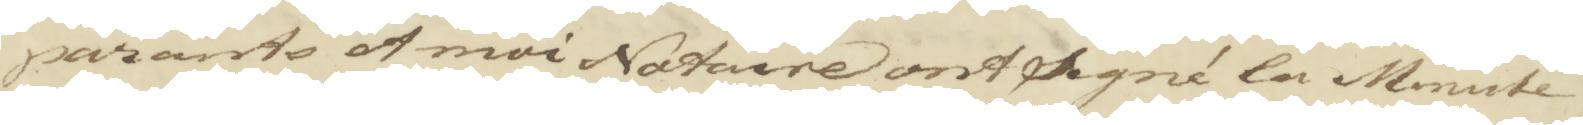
parants et moi Notaire ont signe la Minute
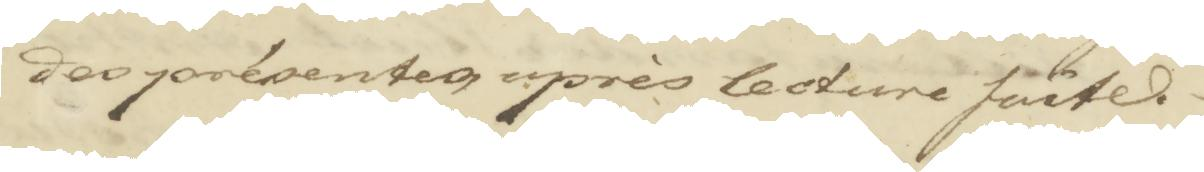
des presentes apres lecture faite.
